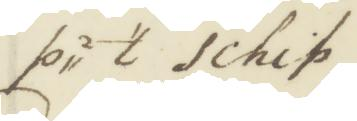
p„r ’t schip
